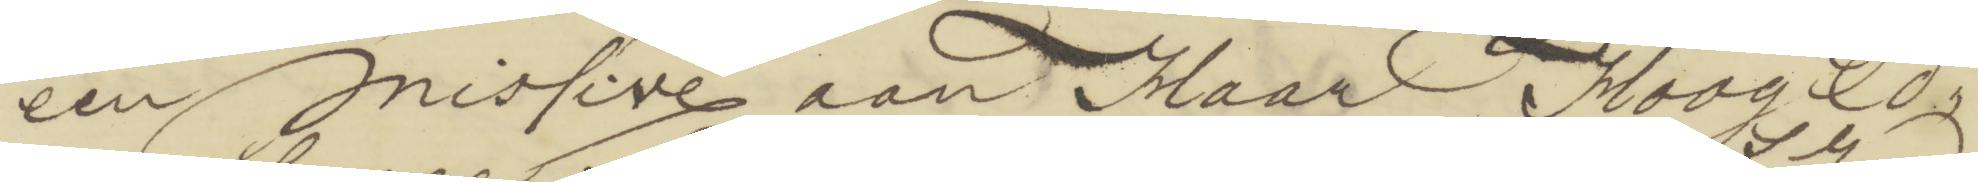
een Missive aan Haar Hoog Ed:s
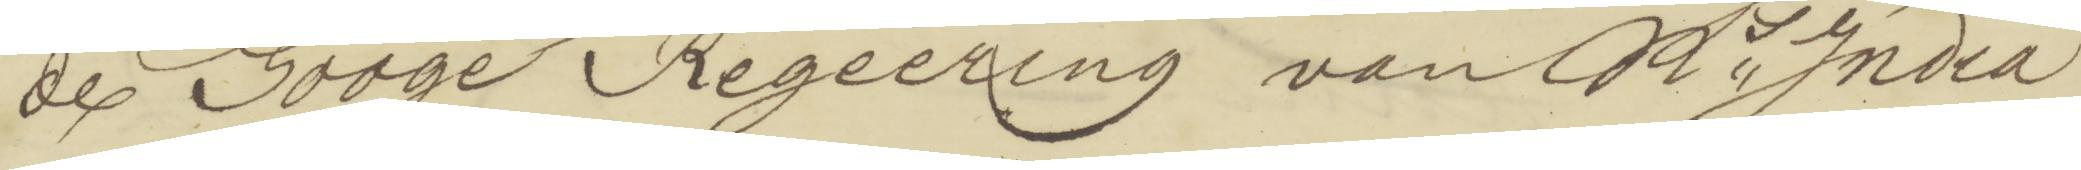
de hooge Regeering van N„s Jndia
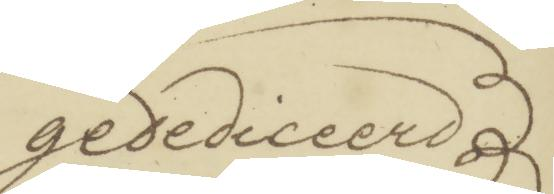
gedediceerd
